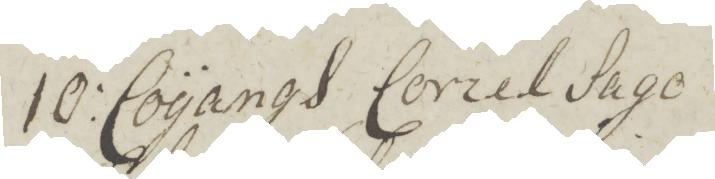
10: Coijangs Correl Sago
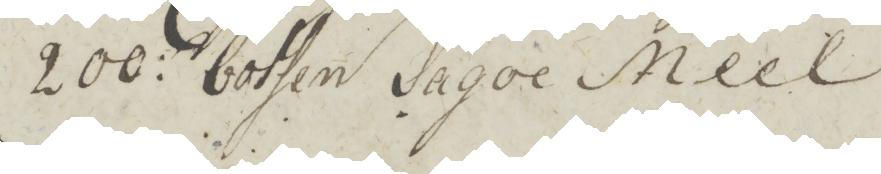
200: bossen Sagoe Meel
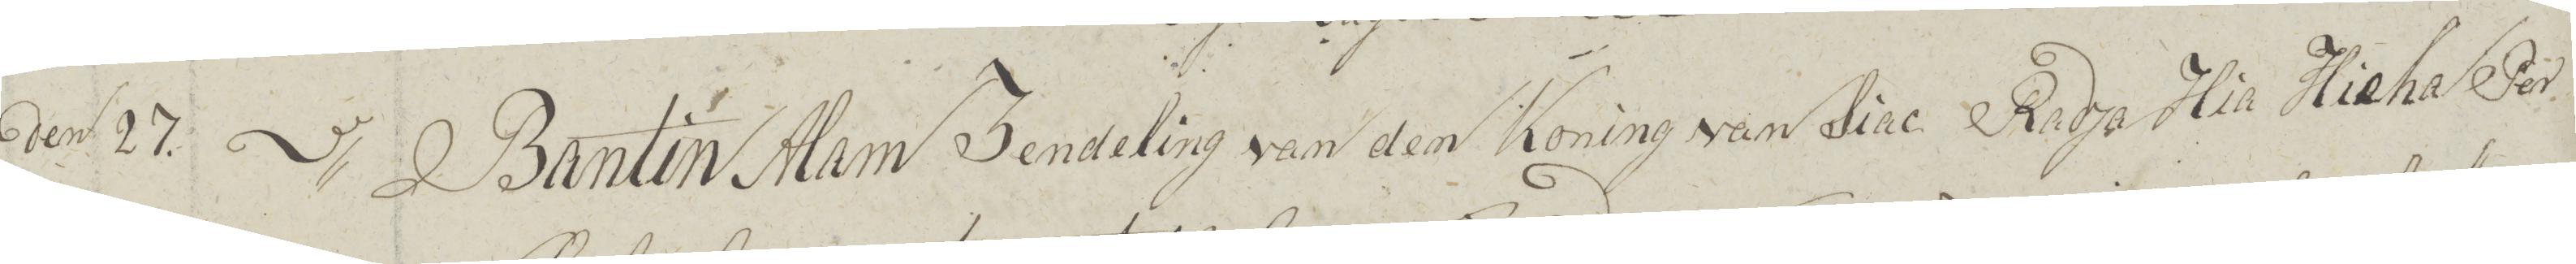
den 27 D„' Bantin Alam Zendeling van den Koning van Siac Radja Hia Hieha Per
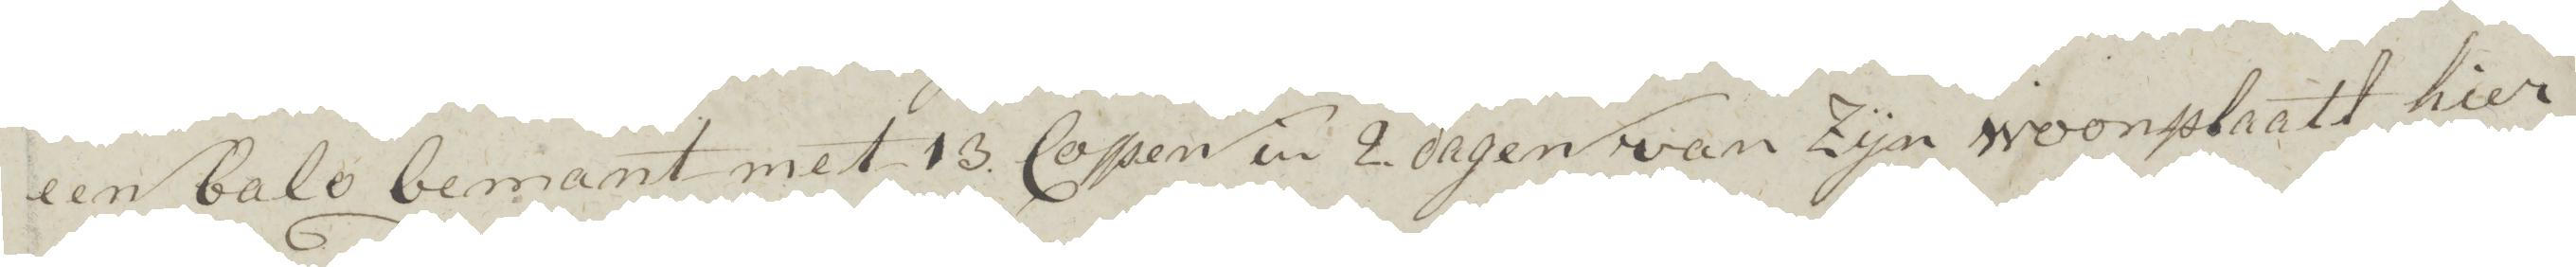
een balo bemant met 13. Coppen in 2. dagen van Zijn woonplaats hier
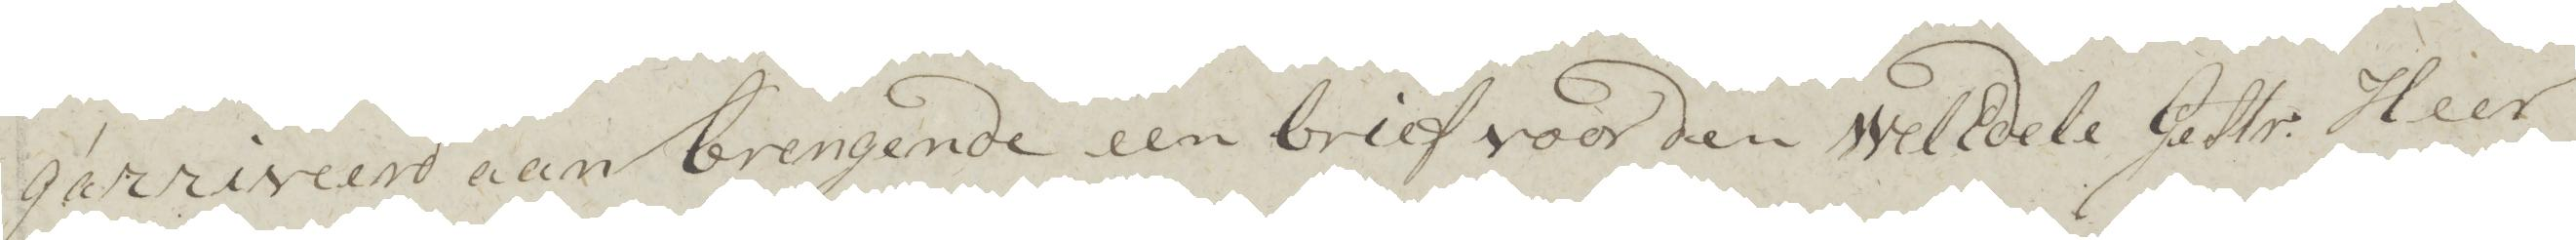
g'arriveerd aan brengende een brief voor den wel Edele Gestr: Heer
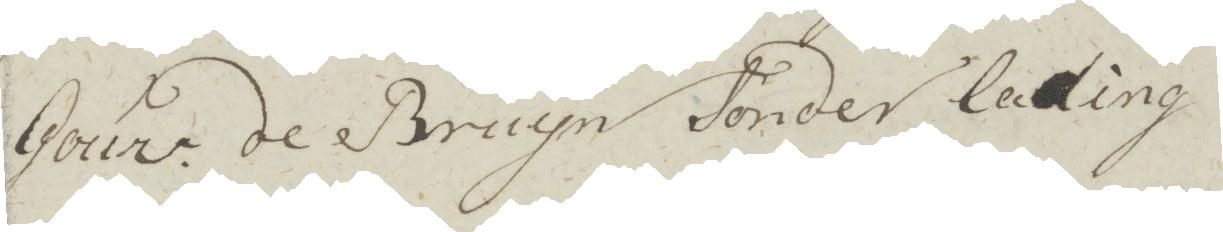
Gouv: de Bruijn Sonder lading
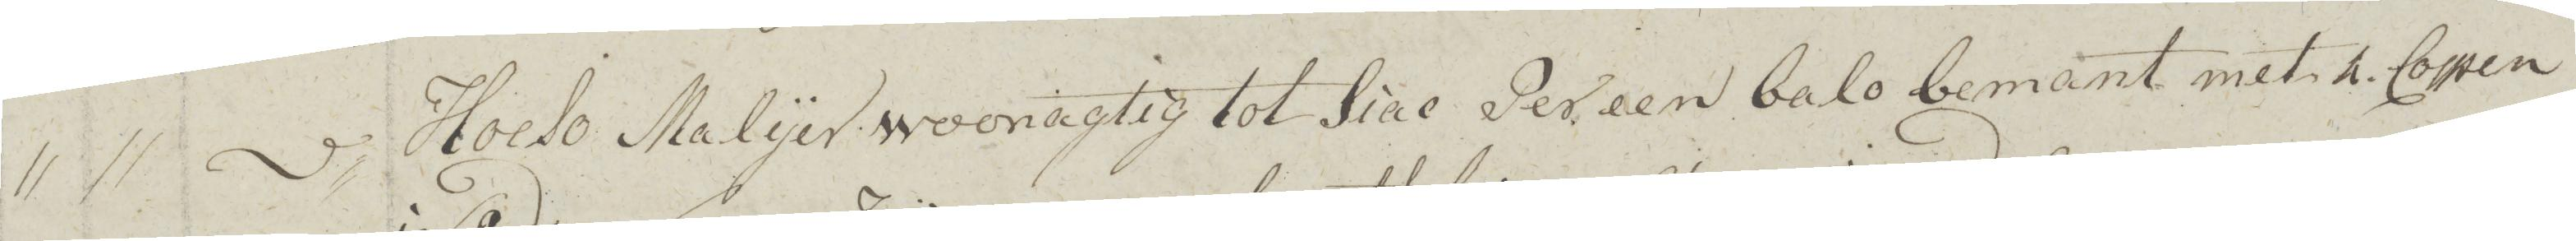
„ „ D„' Hoeso Malijer woonagtig tot Siac Per een balo bemant met 4. Coppen
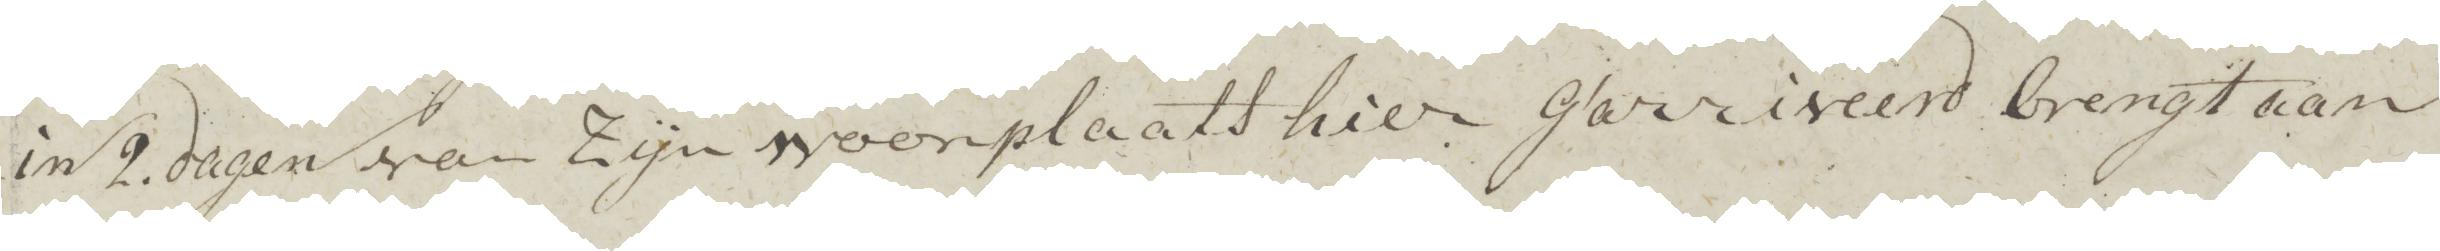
in 2. dagen van Zijn woonplaats hier g'arriveerd brengt aan
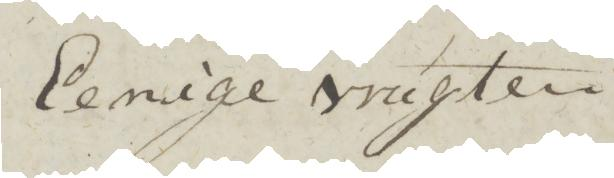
Eenige vrugten
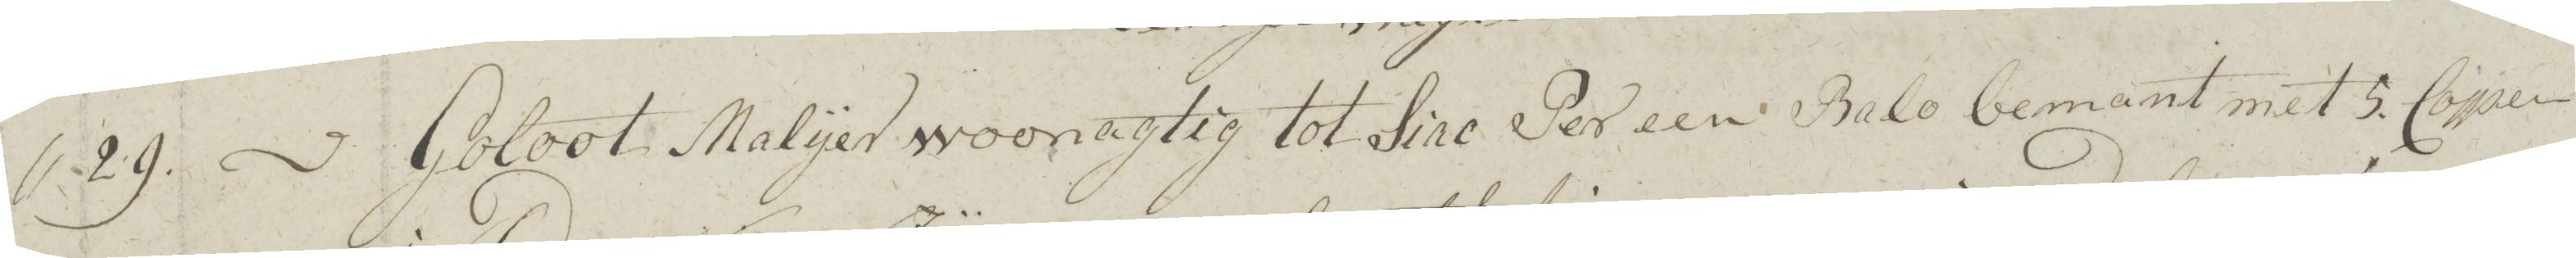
„ 29. D Goloot Malijer woonagtig tot Siac Per een Balo bemant met 5. Coppen
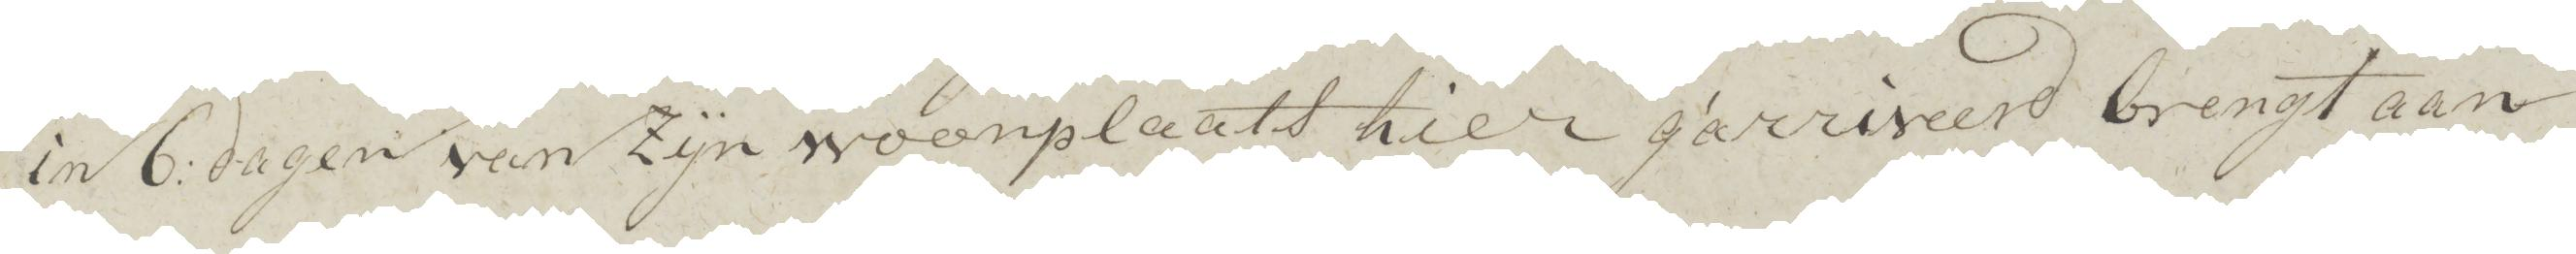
in 6: dagen van Zijn woonplaats hier g'arriveerd brengt aan
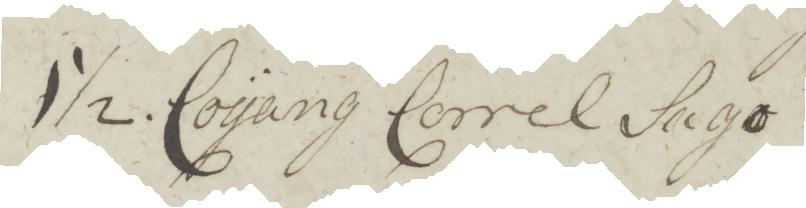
1½. Coijang Correl Sago
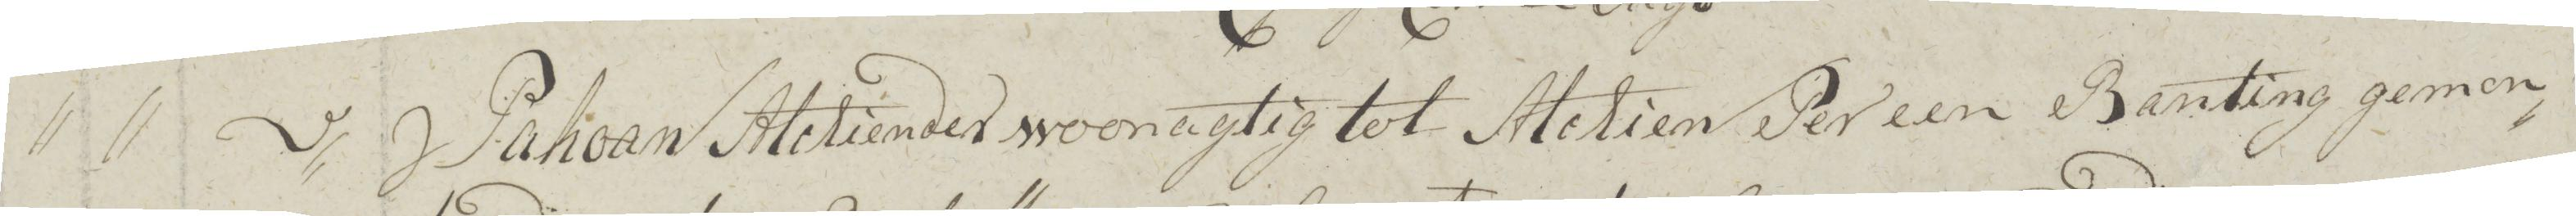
„ „ D„' Pahoan Atchiender woonagtig tot Atchien Per een Banting gemon„
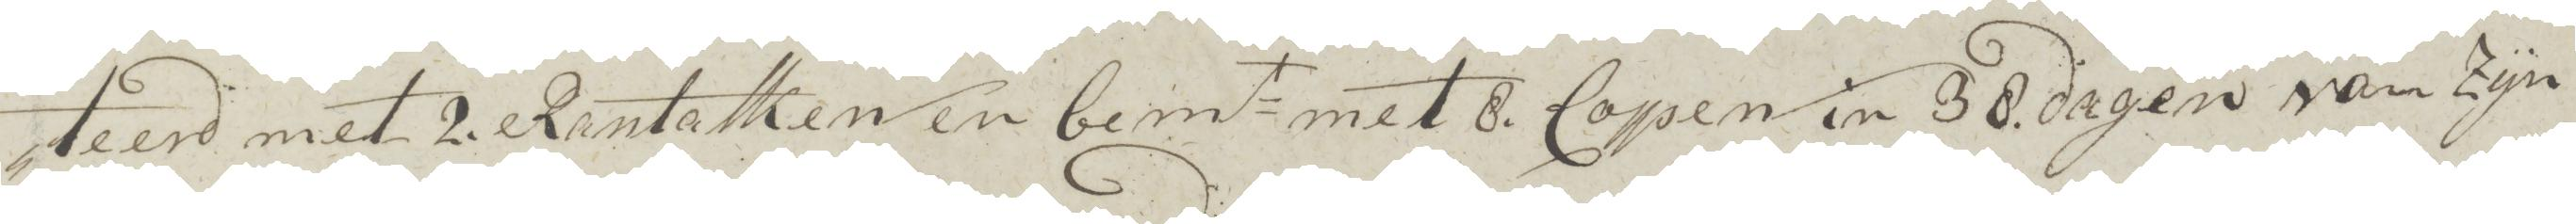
„teerd met 2. Rantakken en bem=t met 8. Coppen in 38. dagen van Zijn
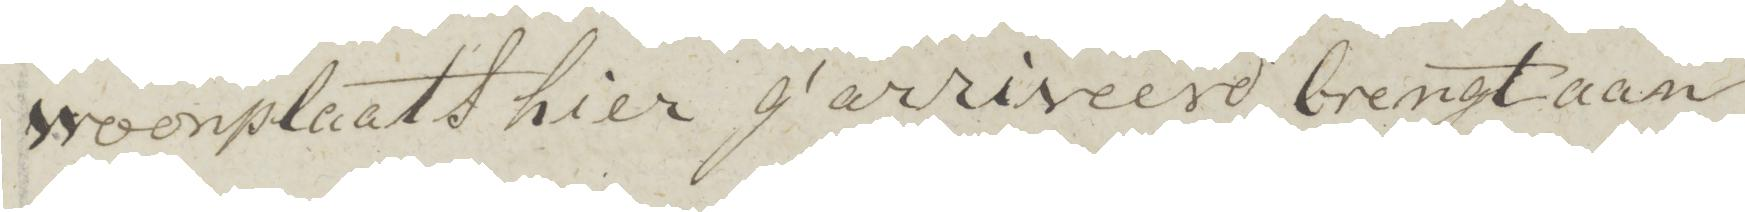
woonplaats hier g’arriveerd brengt aan
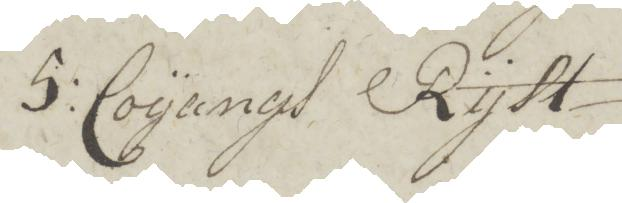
5: Coijangs Rijst
